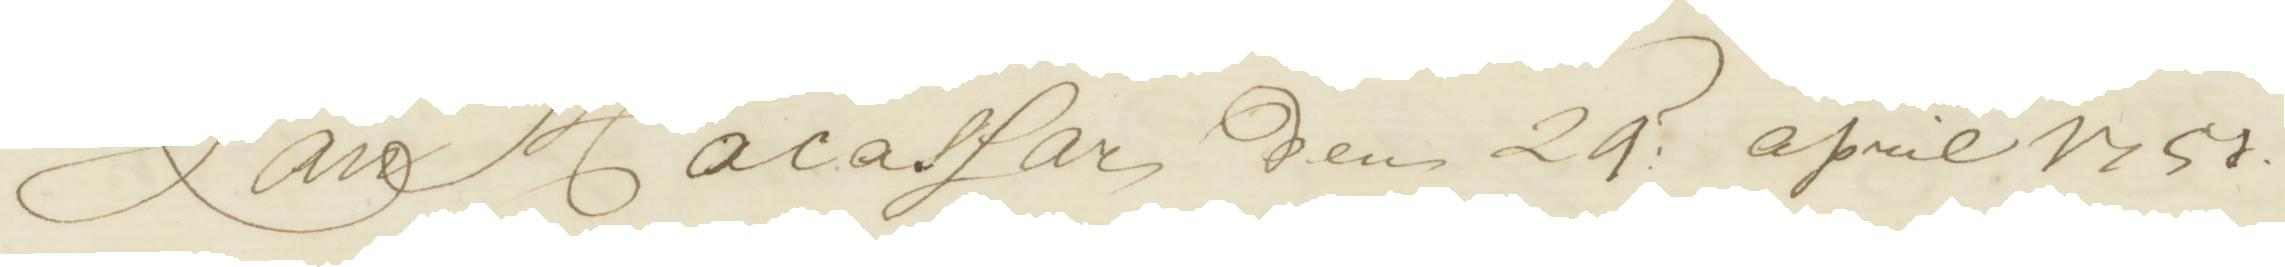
Van Macassar den 29:' april 1751.
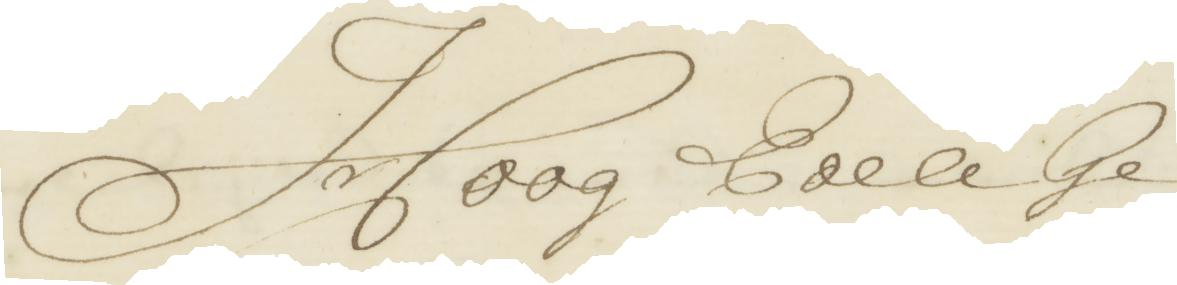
Hoog Edele Ge
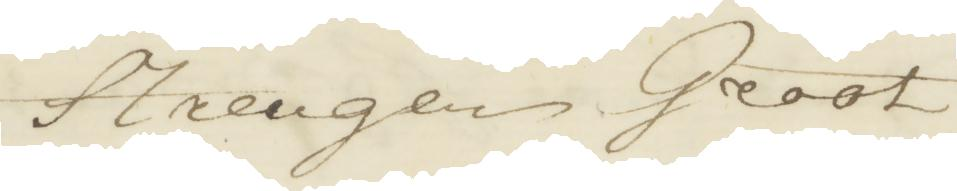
strengen Groot
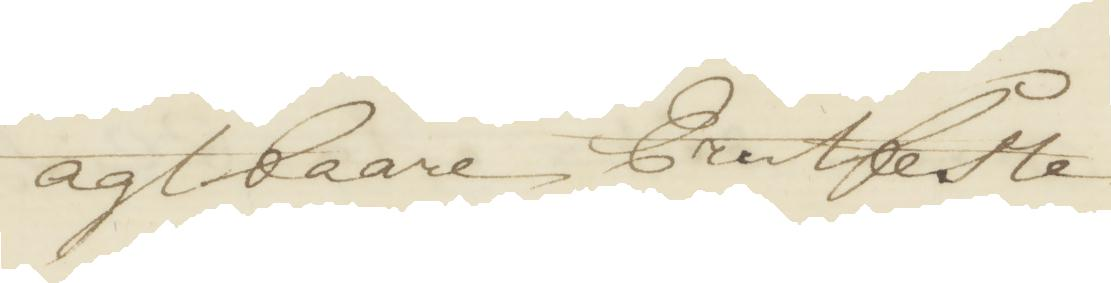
agtbaare Erntfeste
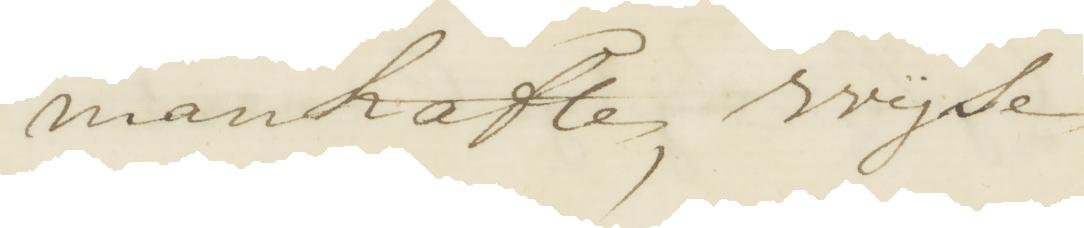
manhafte, wijse
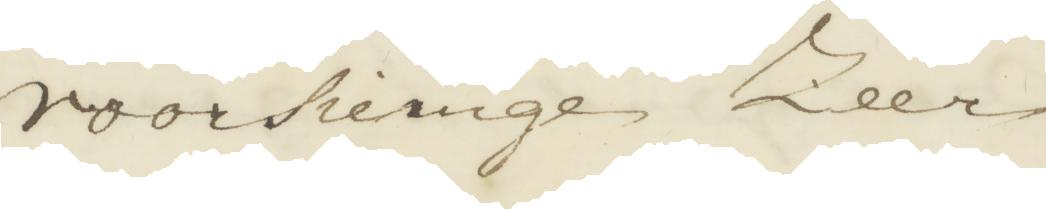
voorsienige zeer
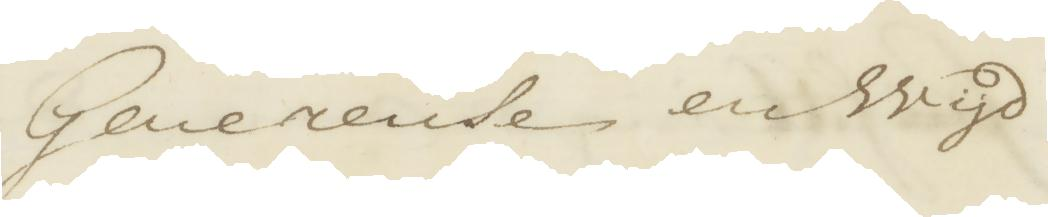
Genereuse en wijd
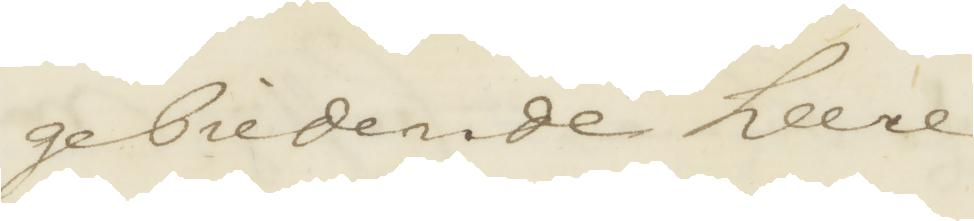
gebiedende heere
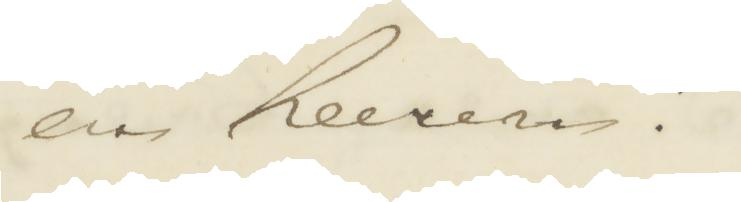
en heeren!
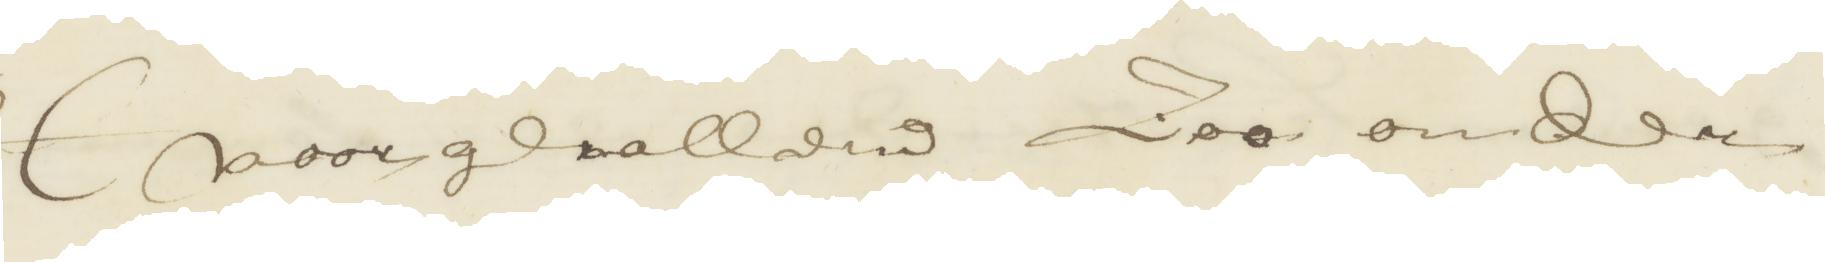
't voorgevallene zoo onder
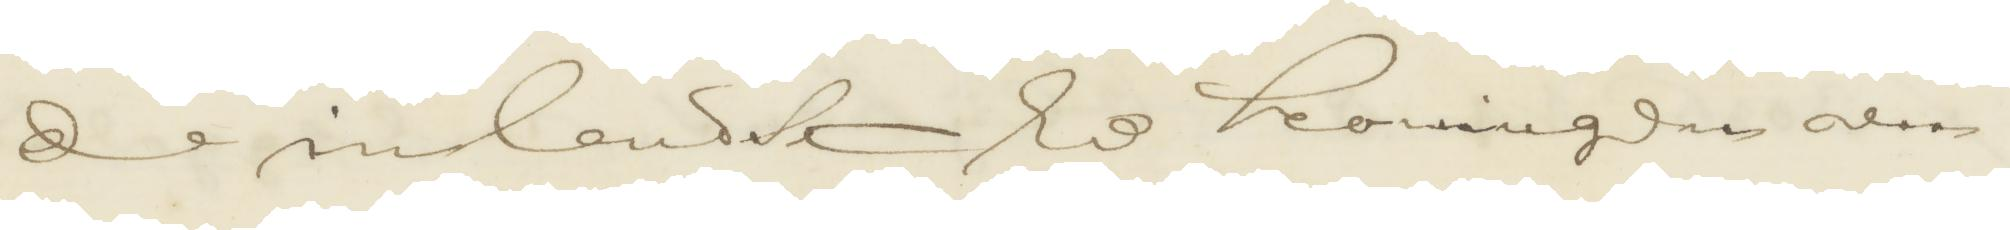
de inlandsche koningen en
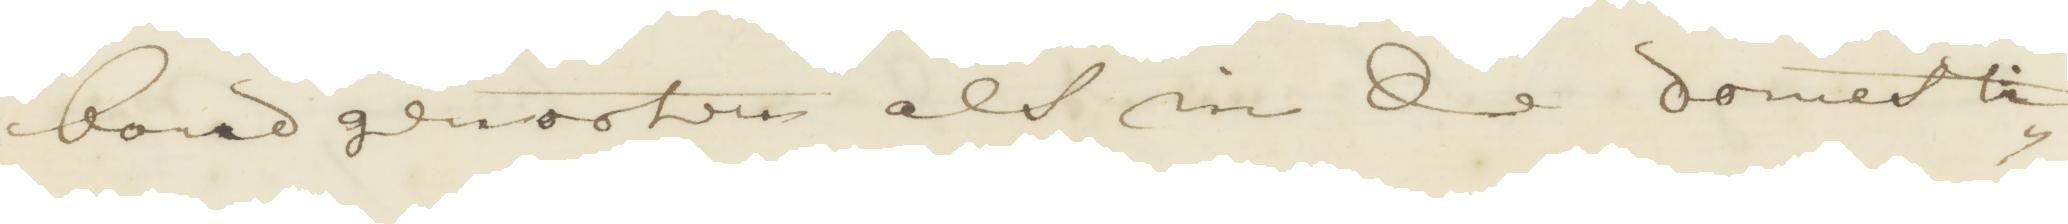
bond genooten als in de domesti„
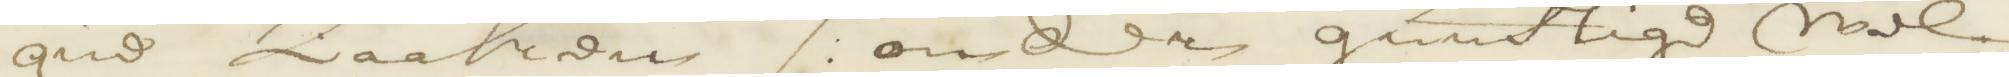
que zaaken /:onder gunstige wel
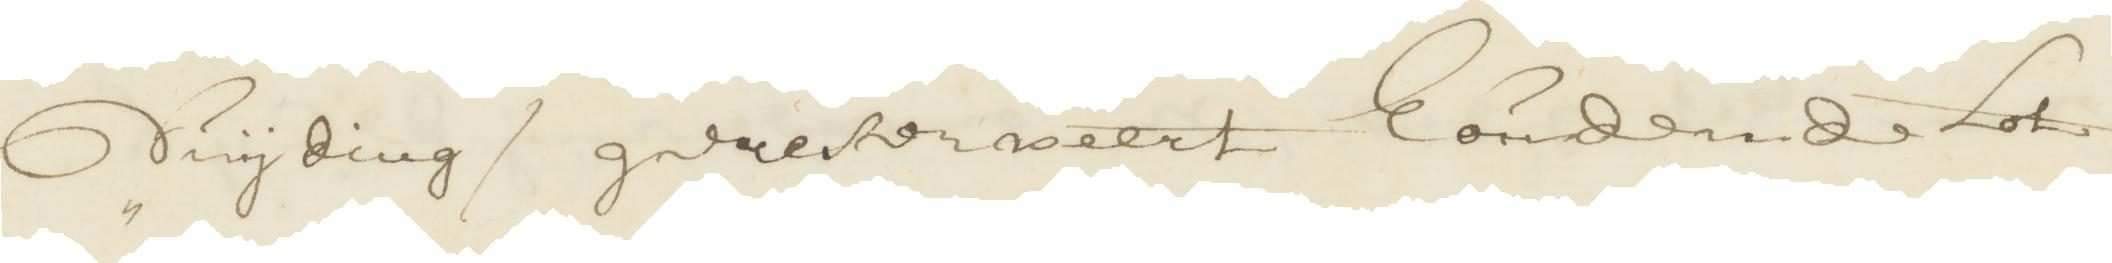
duijding/ gereserveert houdende tot
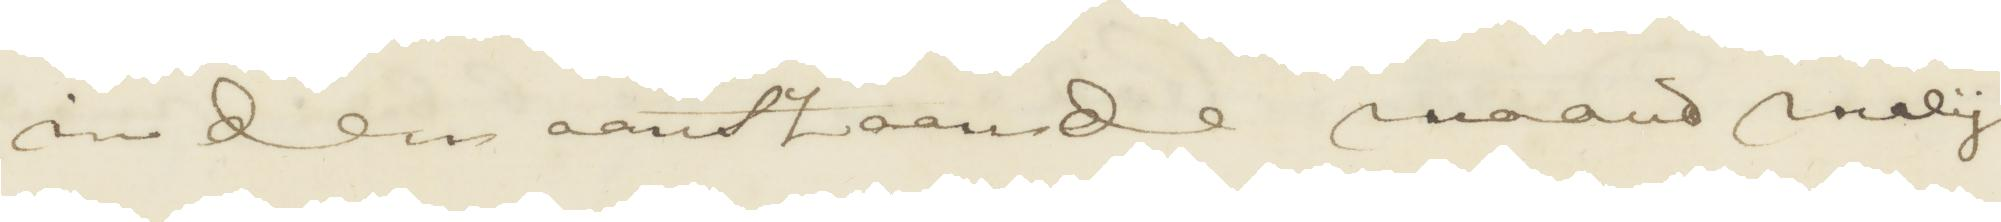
in den aanstaande maand meij
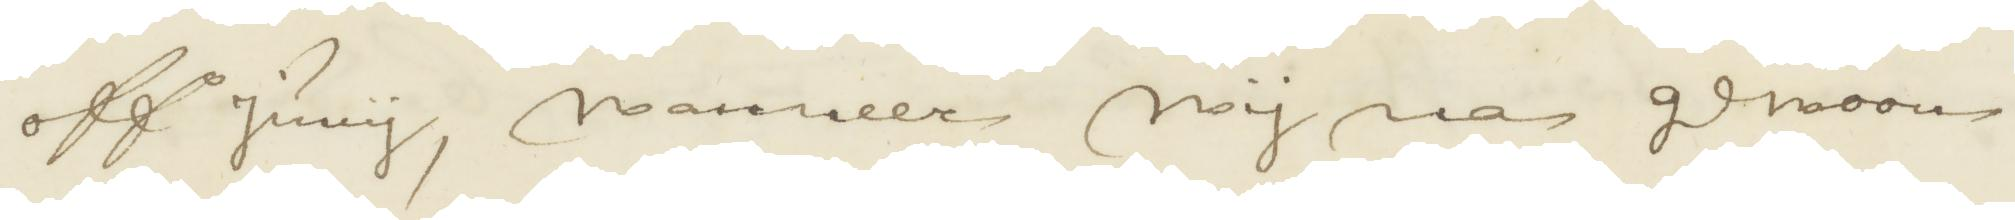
off junij, wanneer wij na gewoon
